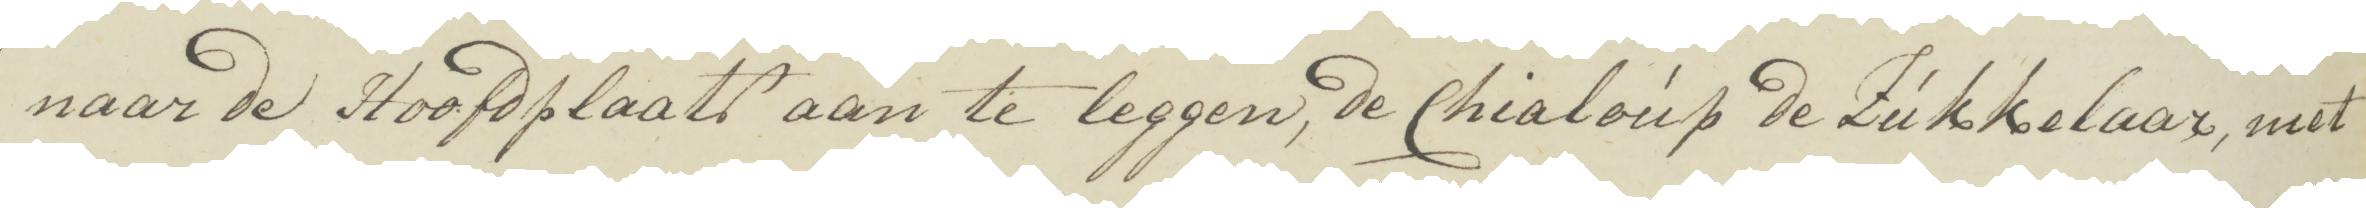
naar de Hoofdplaats aan te leggen, de Chialoup de zukkelaar, met
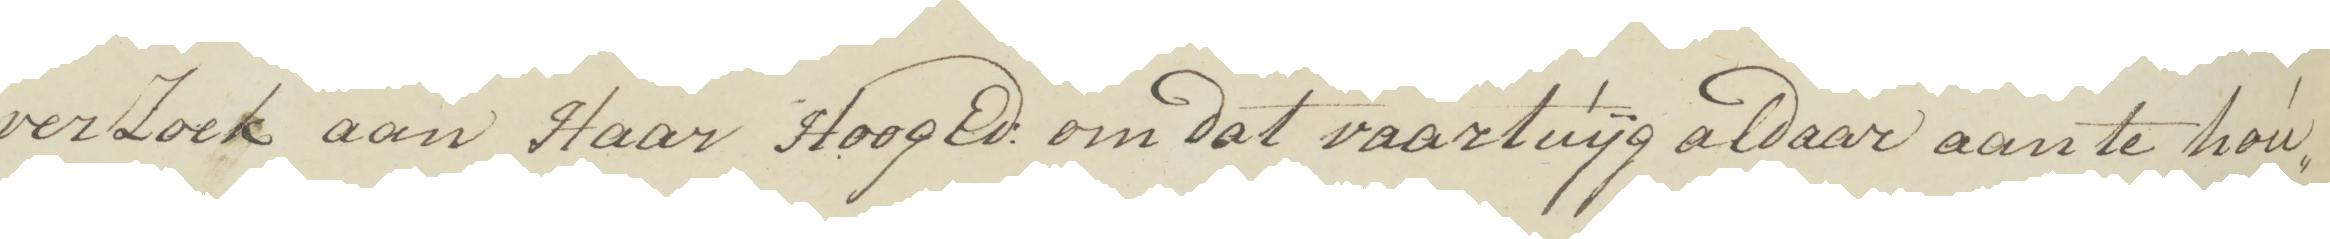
verzoek aan Haar Hoog Ed: om dat vaartuijg aldaar aan te hou„
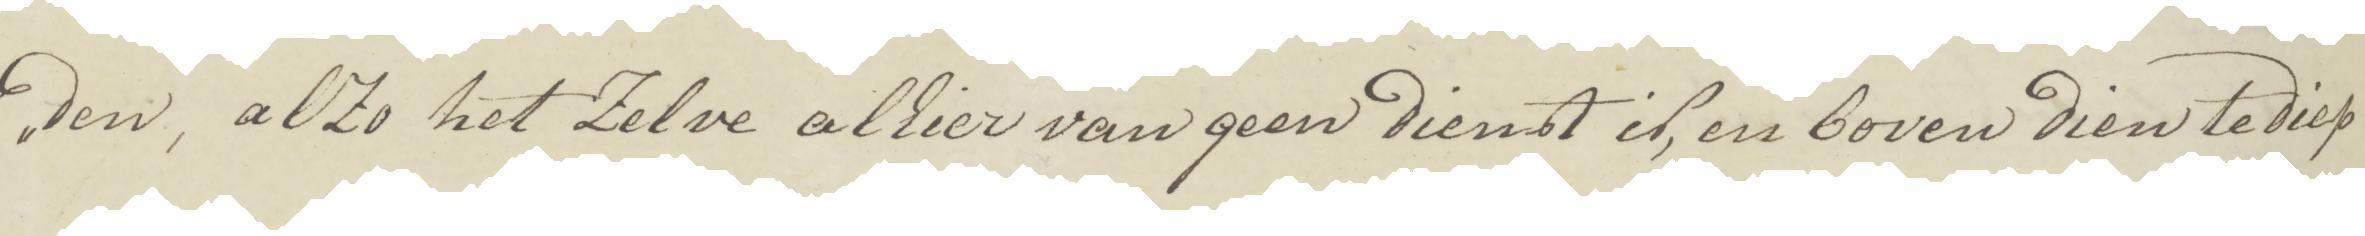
den, alzo het zelve alhier van geen dienst is, en boven dien te diep
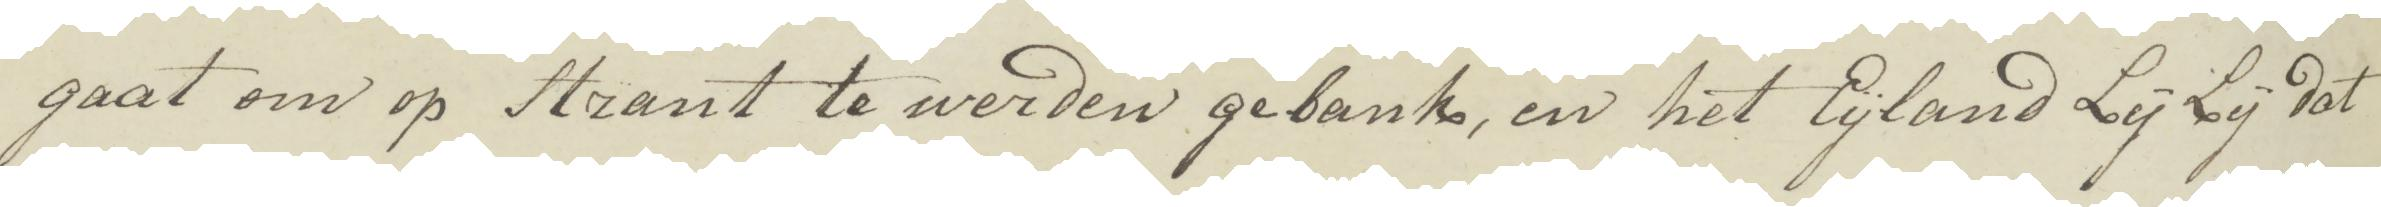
gaat om op strant te werden gebank, en het Eijland Lij Lij dat
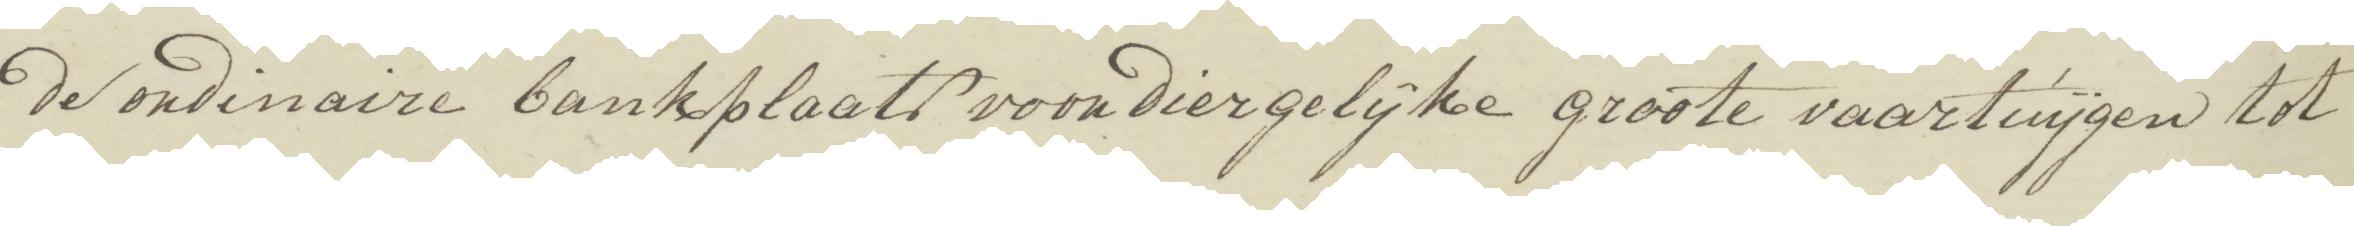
de ordinaire bankplaats voor diergelijke groote vaartuijgen tot
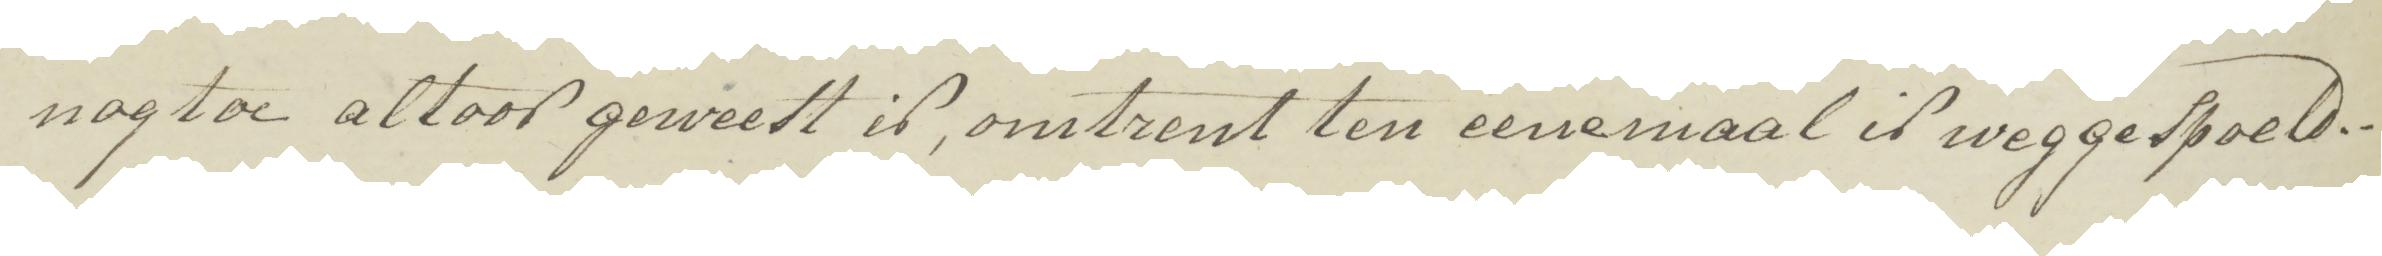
nog toe altoos geweest is, omtrent ten eenemaal is weggespoeld.
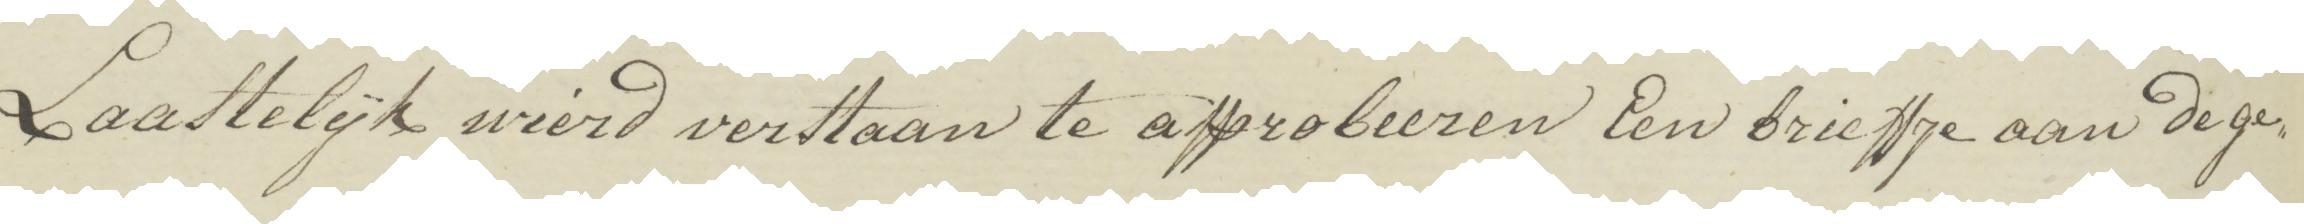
Laastelijk wierd verstaan te approbeeren Een brieffje aan de ge„
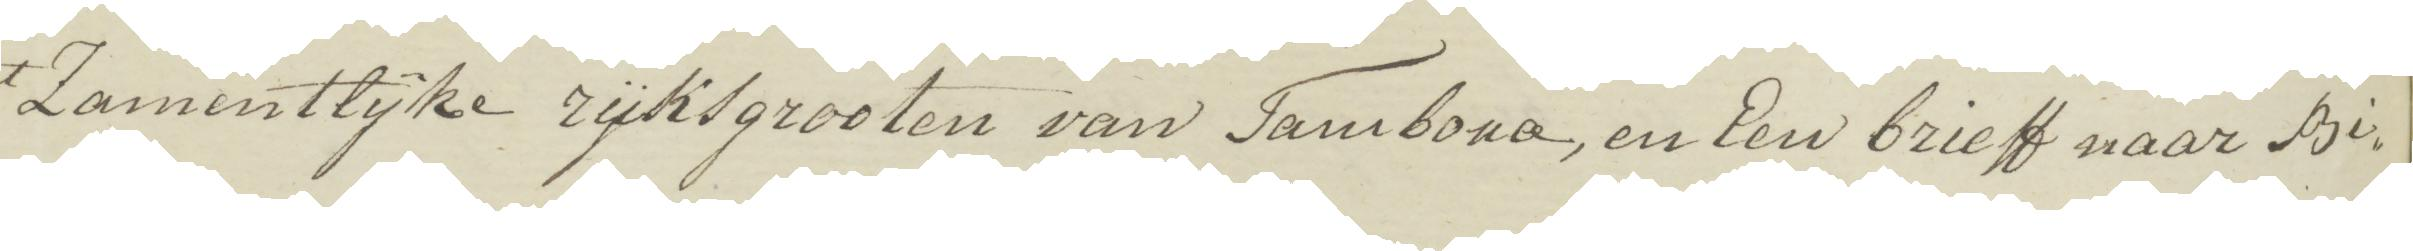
zamentlijke rijksgrooten van Tambora, en Een brieff naar Bi„
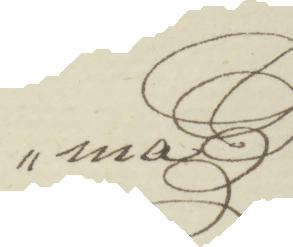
„ma
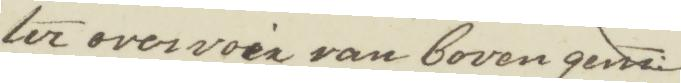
ter overvoer van boven gem:
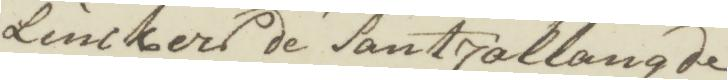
Linckers de Pantjallang de
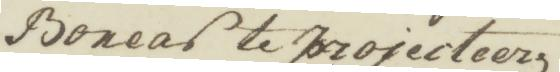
Borcas te projecteeren
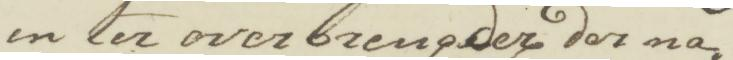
en ter overbreng der der na„
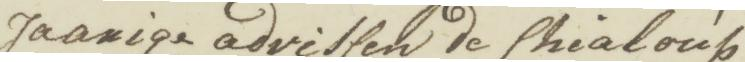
jaarige advissen de Chialoup
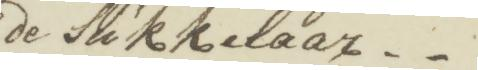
de sukkelaar - -
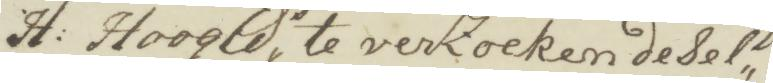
H: Hoog Ed„s te verzoeken desel„
